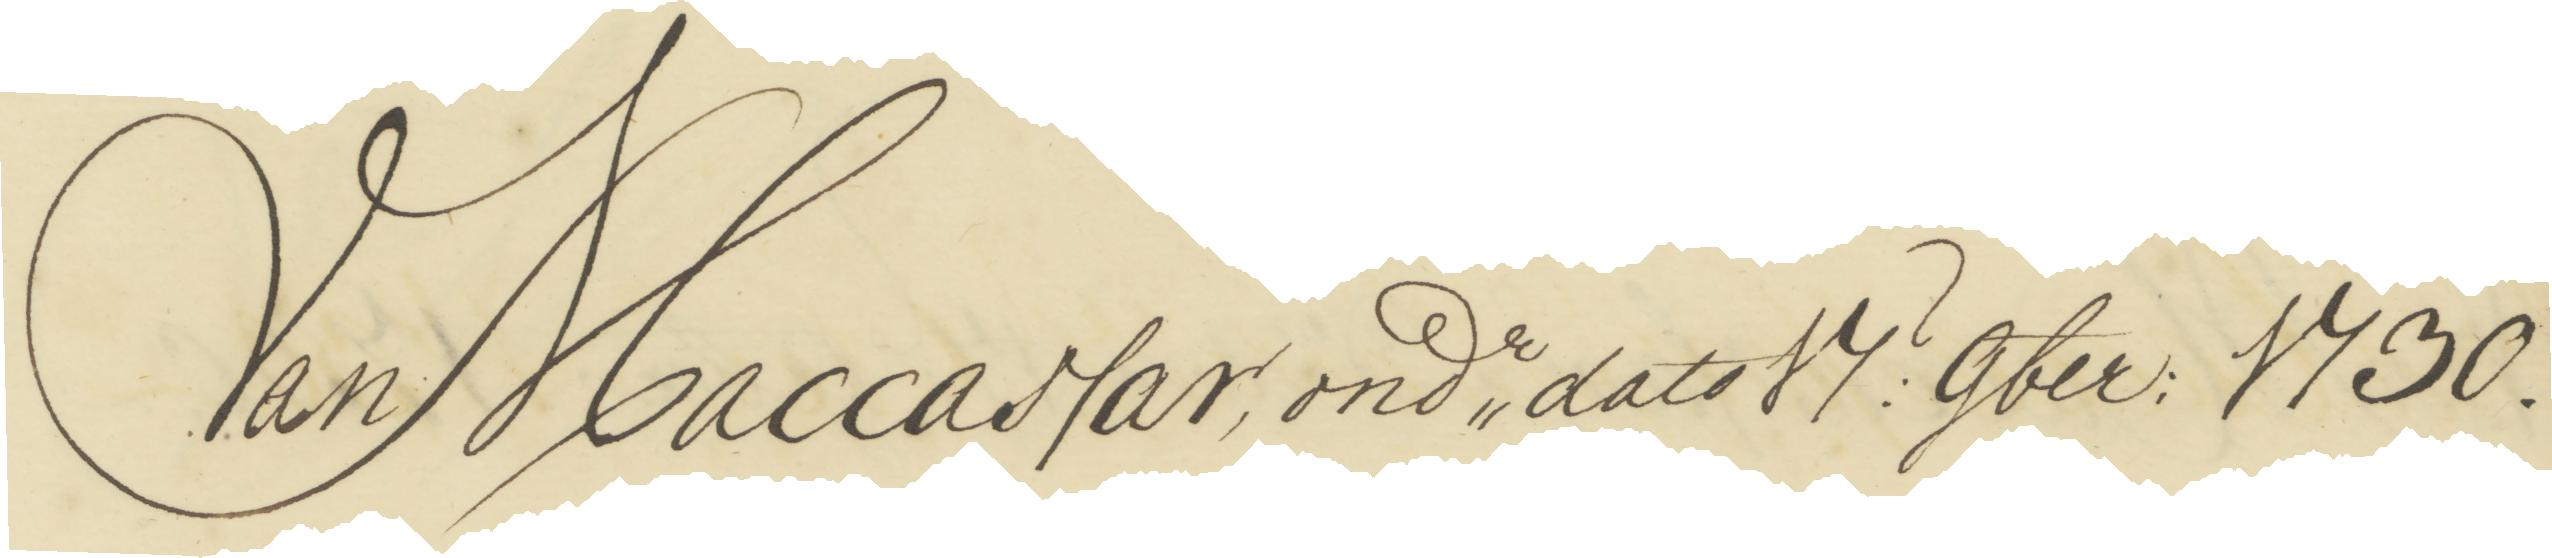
Van Maccassar, ond„r dato 17:' 9ber: 1730.
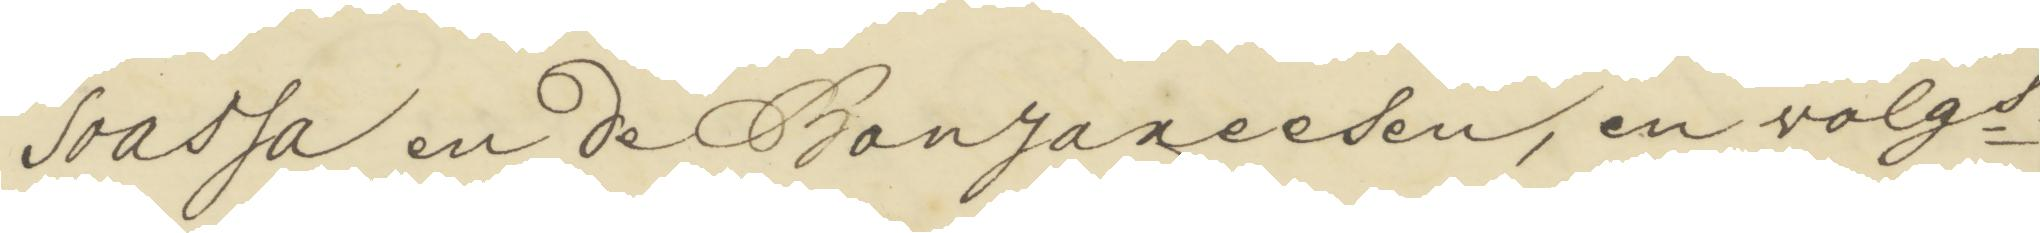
Toassa en de Banjareesen, en volg=s
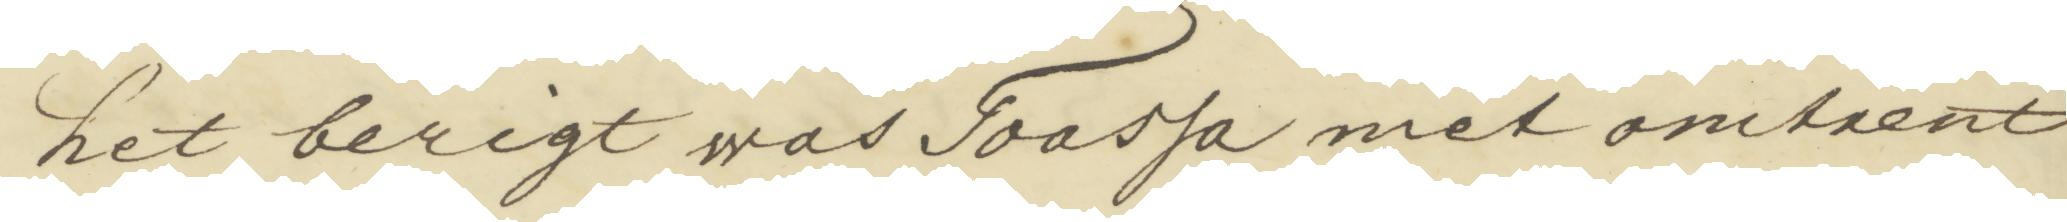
het berigt was Toassa met omtrent
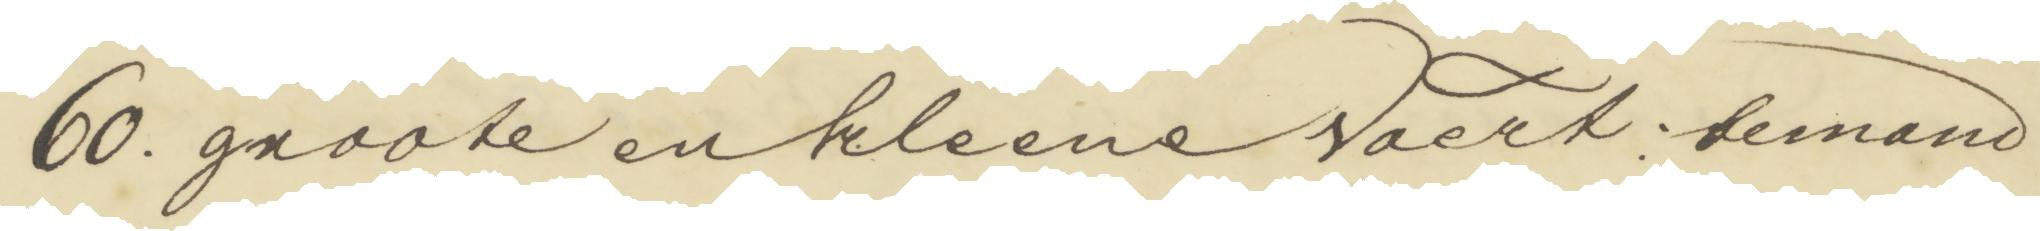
60. groote en kleene vaert: bemand
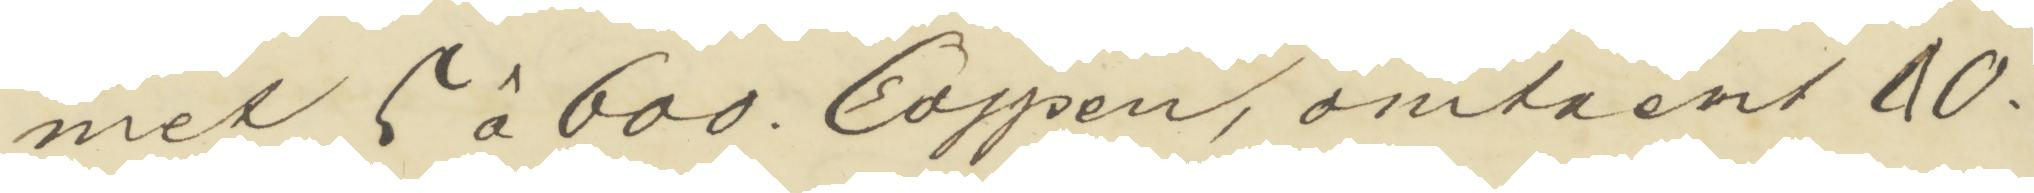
met 5 â 600. Coppen, omtrent 40.
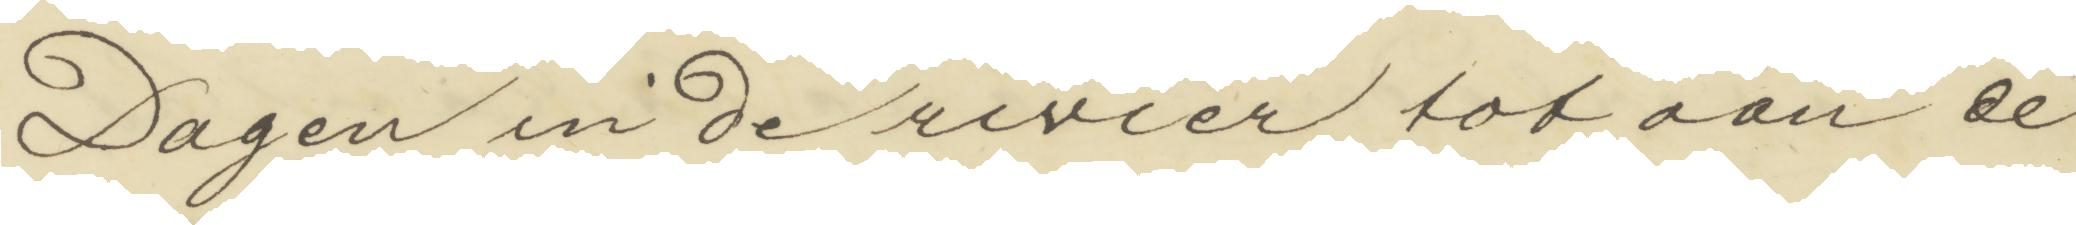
Dagen in de rivier tot aan de
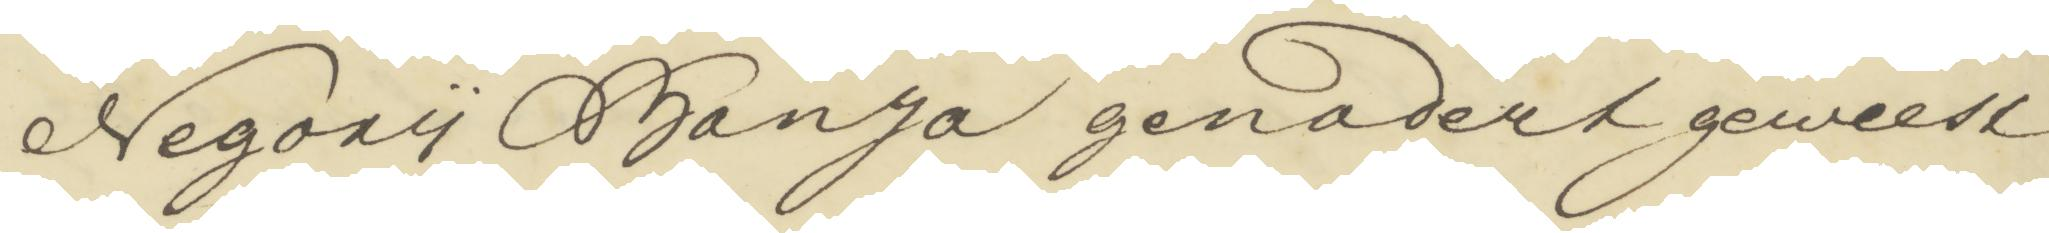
Negorij Banja genadert geweest
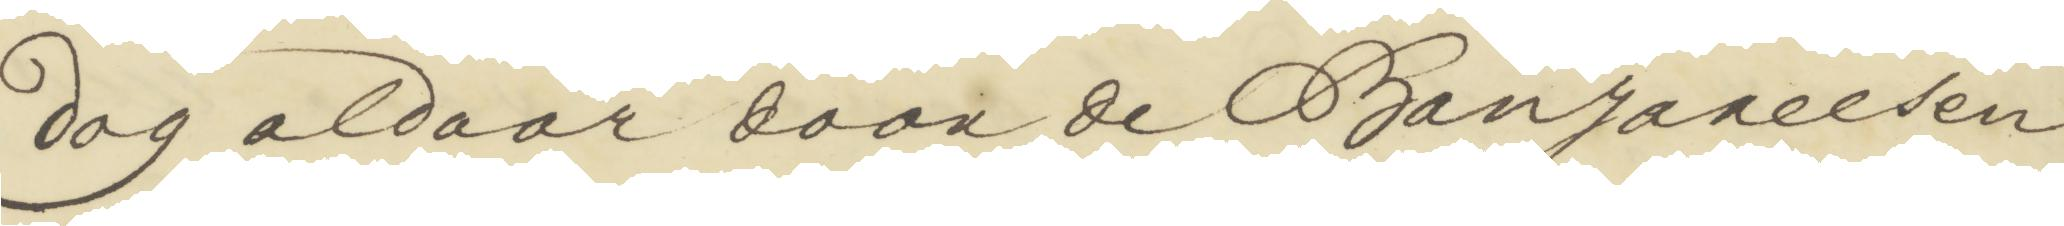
dog aldaar door de Banjareesen
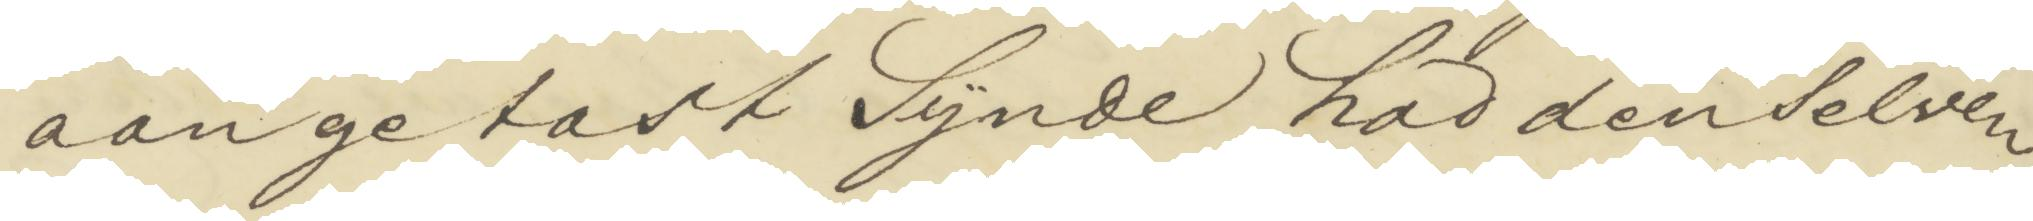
aangetast sijnde had denselven
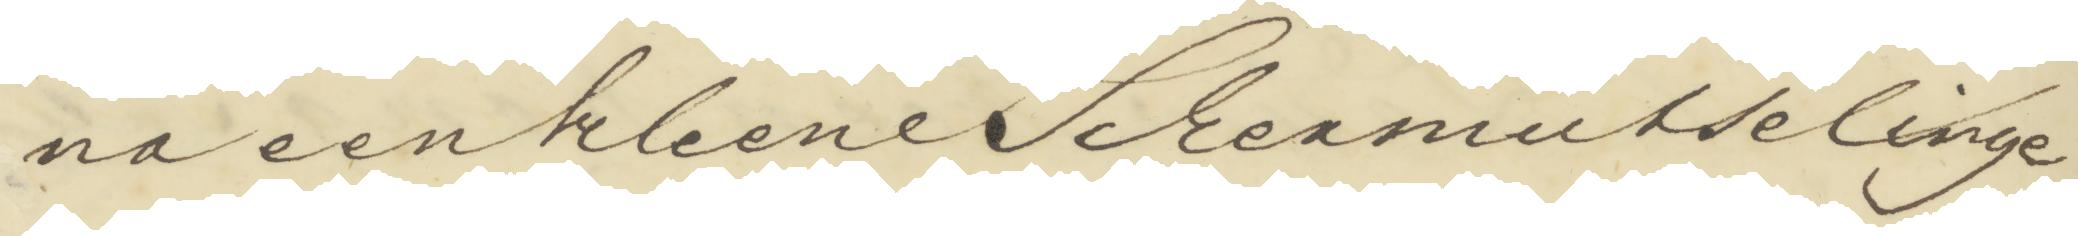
na een kleene schermutselinge
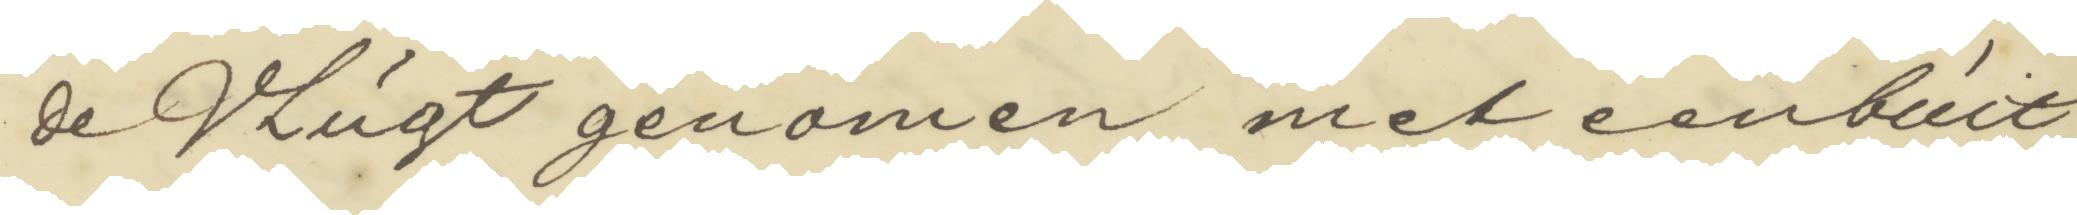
de Vlugt genomen met een buit
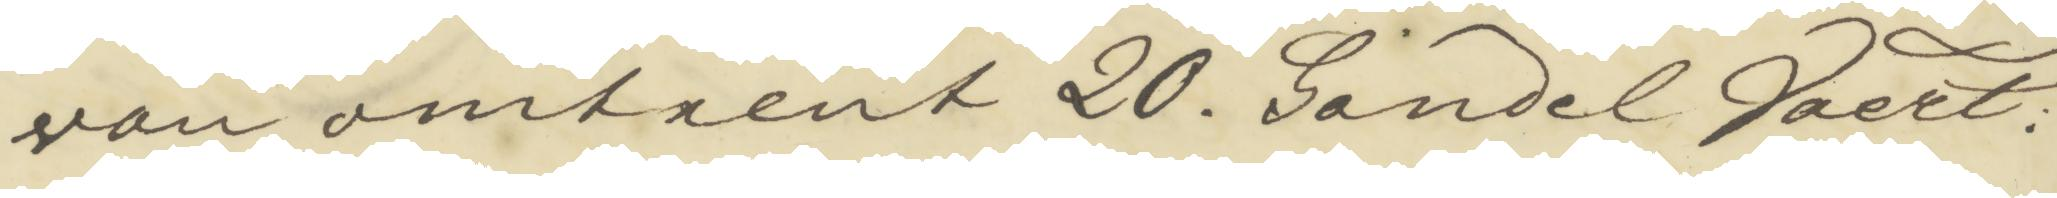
van omtrent 20. handel Vaert:
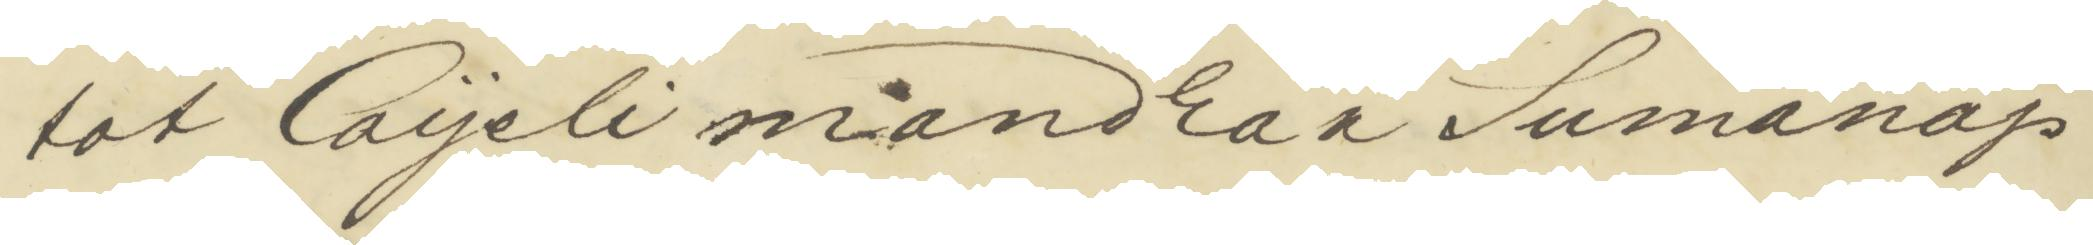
tot Caijeli mandhar sumanap
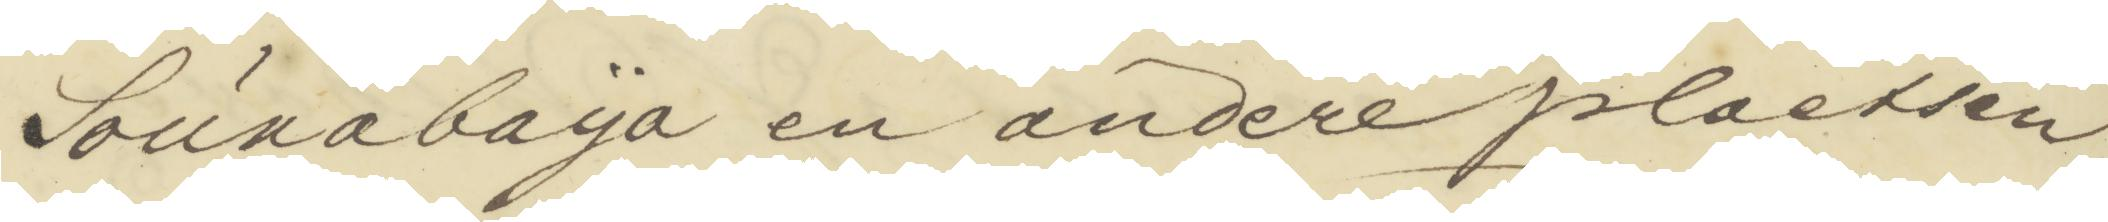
sourabaija en andere plaetsen
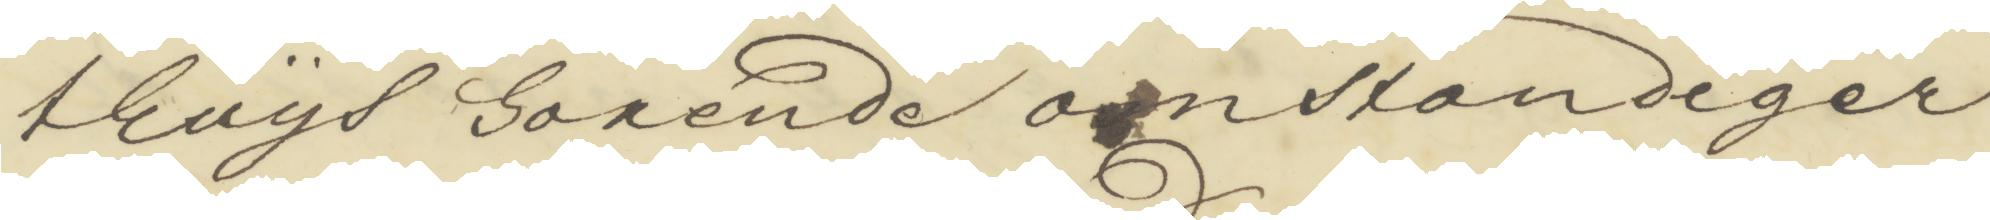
thuijs horende omstandiger
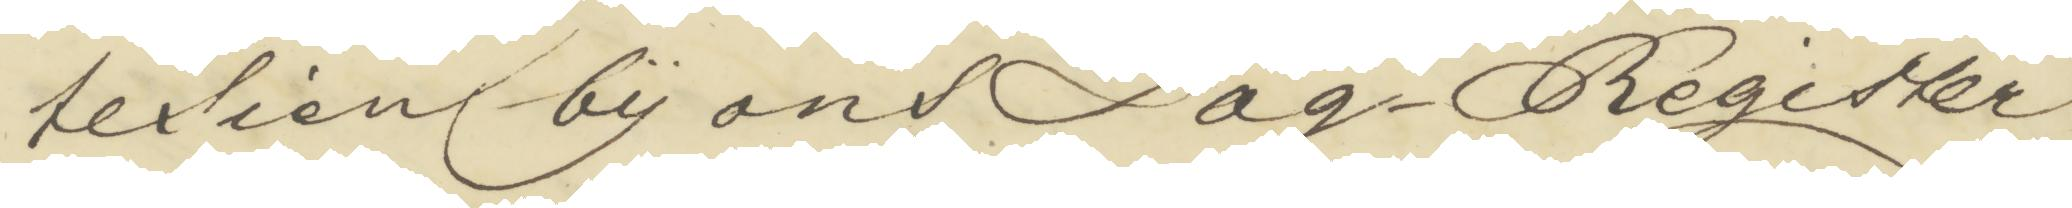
tesien bij ons Dag-Register
